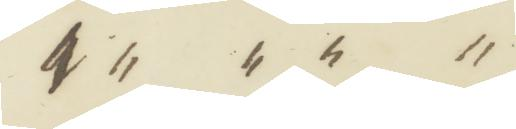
4 „ „ „ „
